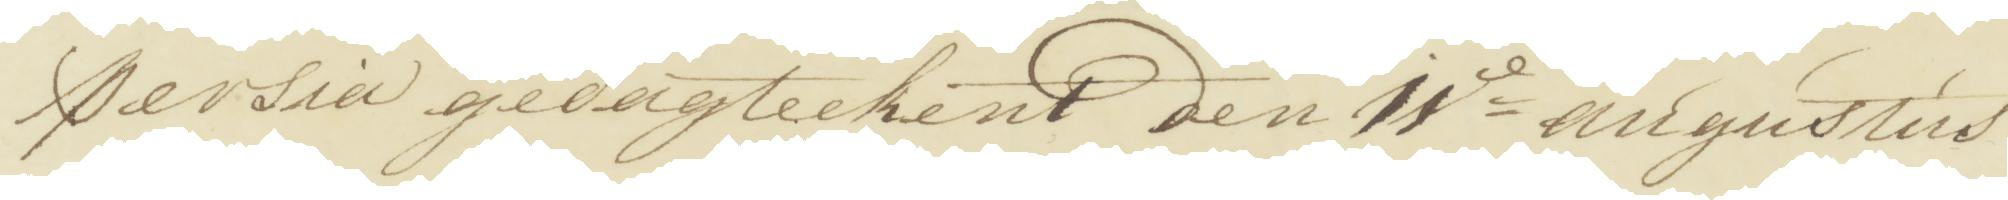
Persia gedagteekent den 11=' augustus
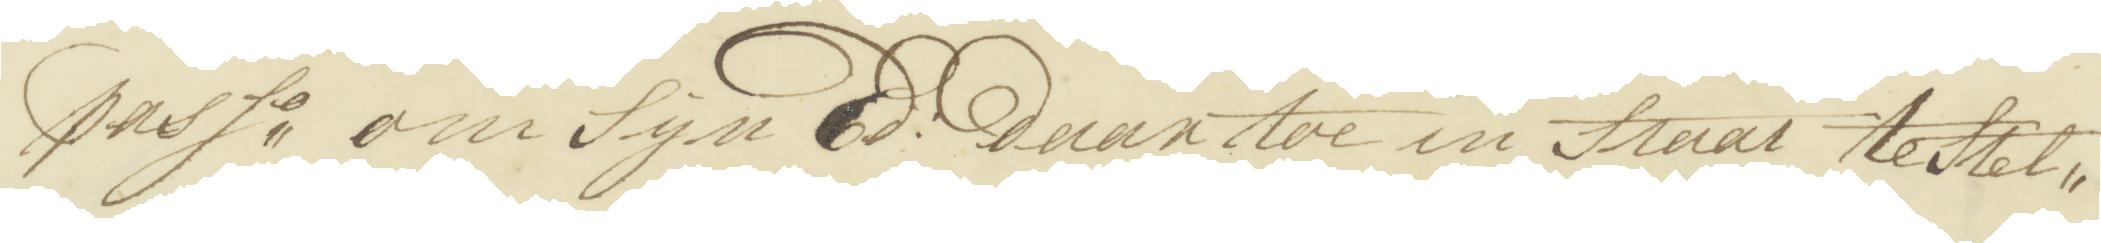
pass„o om sijn Ed: daar toe in staat te stel„
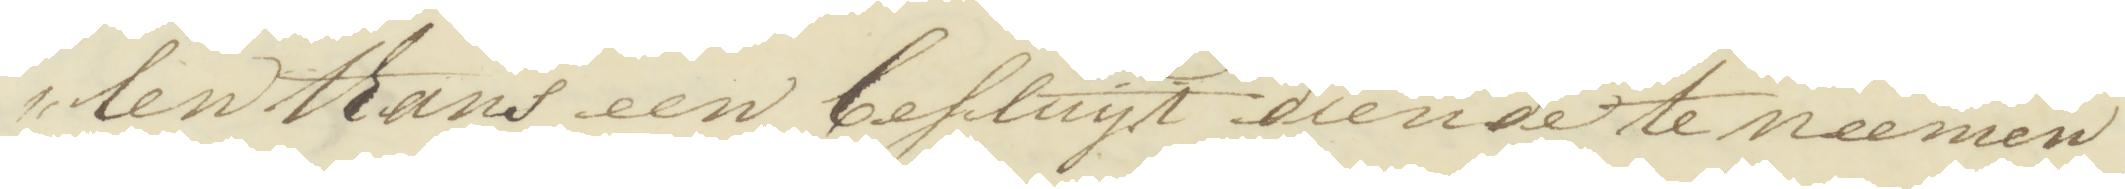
len thans een besluijt diende te neemen
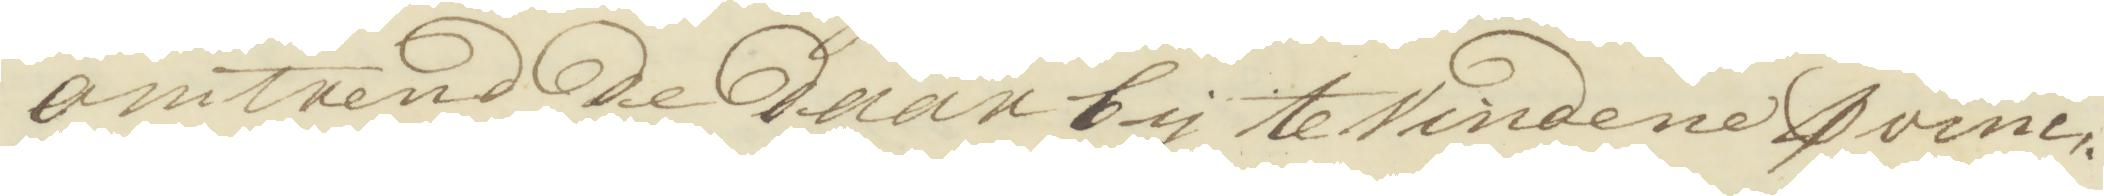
omtrend de daar bij te vindene poinc„
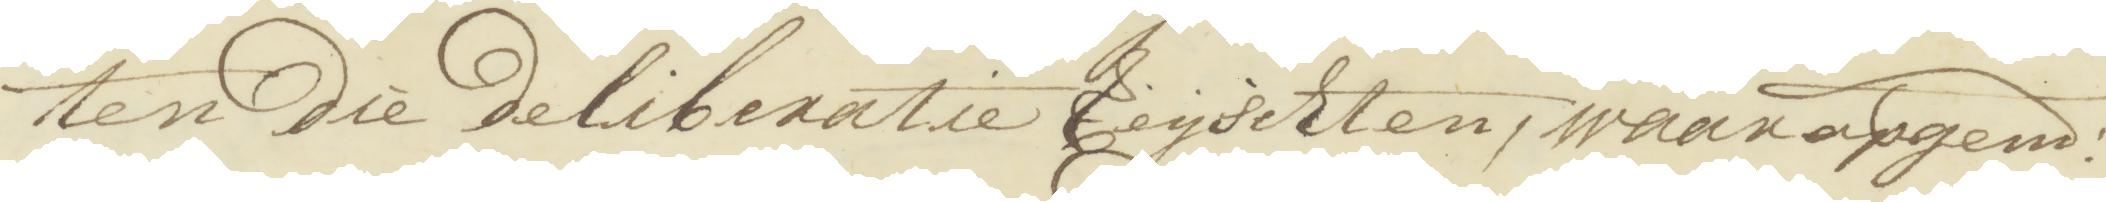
ten die deliberatie vereijschten, waarop gend:
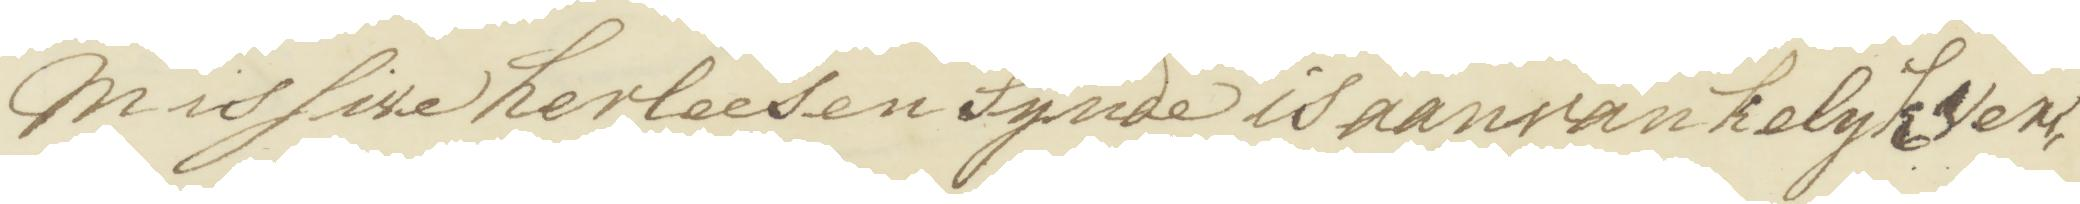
missive herleesen sijnde is aanvankelyk ver„
